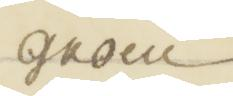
groen
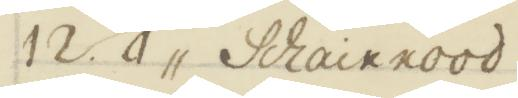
12.¾ „ schairrood
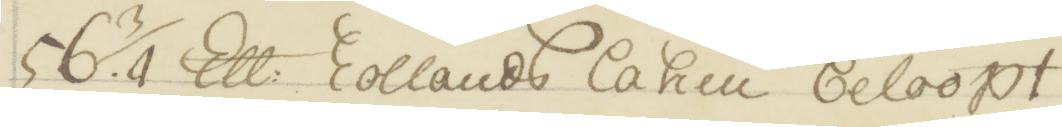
56.¾ Ell: hollands laken beloopt
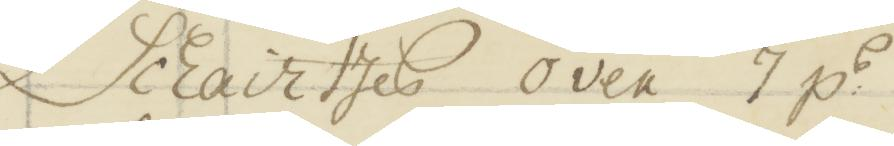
Schairtjes over 7 p:s
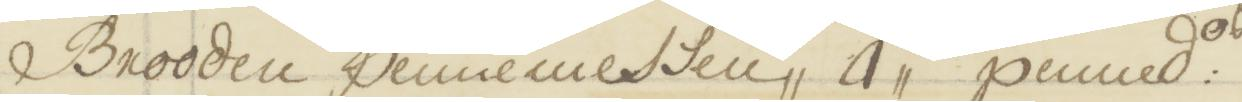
Brooden Pennemessen„ 4 „ penned:os
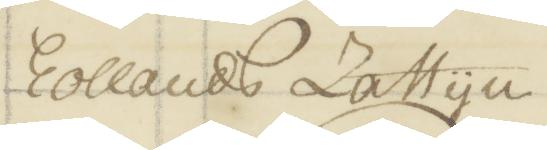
hollands zattijn
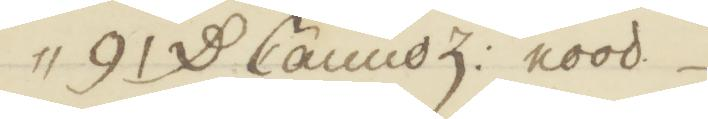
„ 91 ps Cannsz: rood.
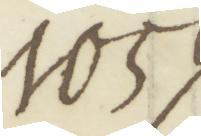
1057
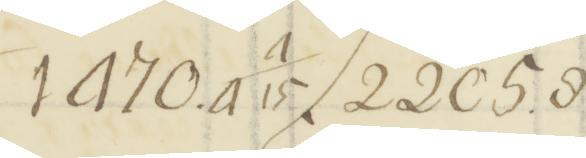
1470.4 4/15 ƒ 2205.8
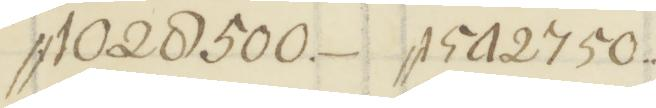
„1028500.— „1542750
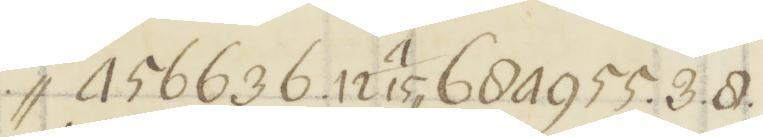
„ 456636.12 4/15„684955.3.8.
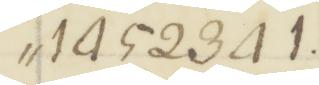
„1452341.
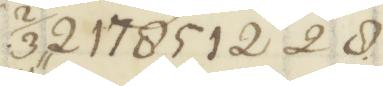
6.2/3„2178512 2 8.
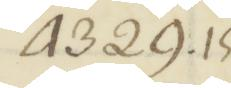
4329.15 11/15
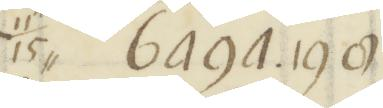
6494.19 8
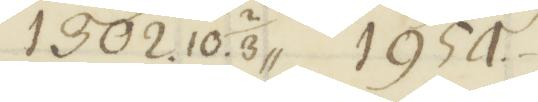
1302.10. 2/3„ 1954.
